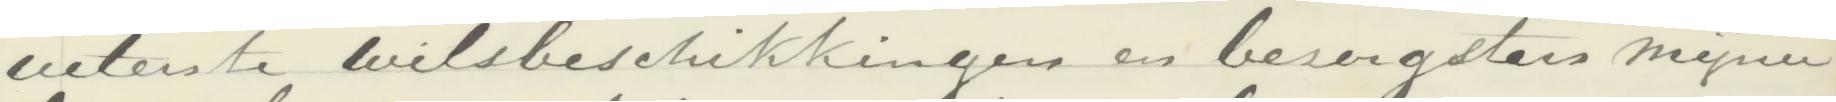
uiterste wilsbeschikkingen en bezorgsters myner
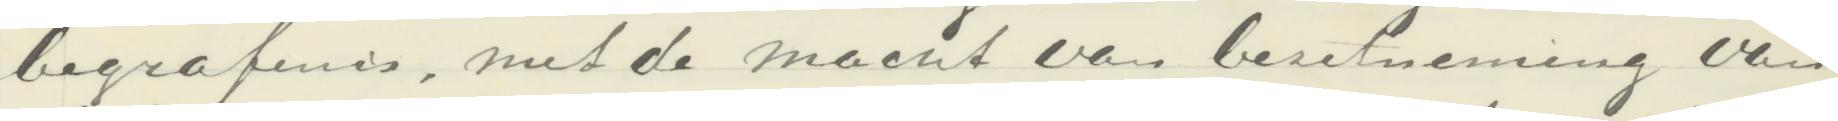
begrafenis, met de macht van bezitneming van
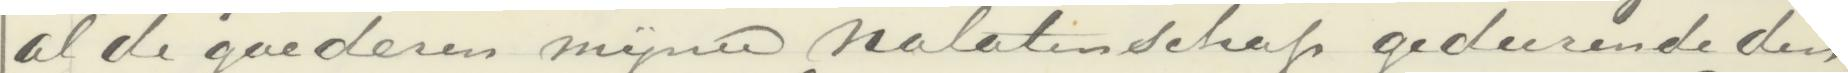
al de goederen mijner nalatenschap gedurende den
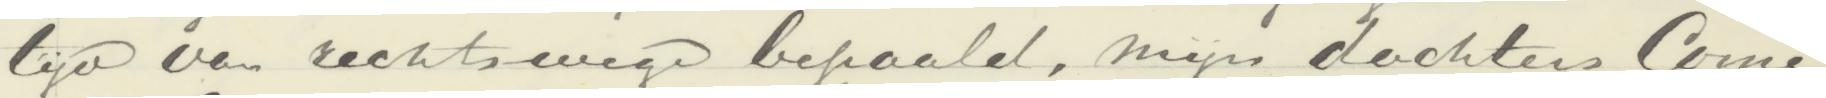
tijd van rechtswege bepaald, mijn dochters Corne
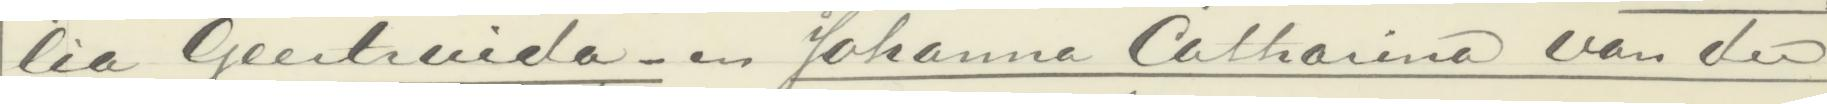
lia Geertruida - en Johanna Catharina van der
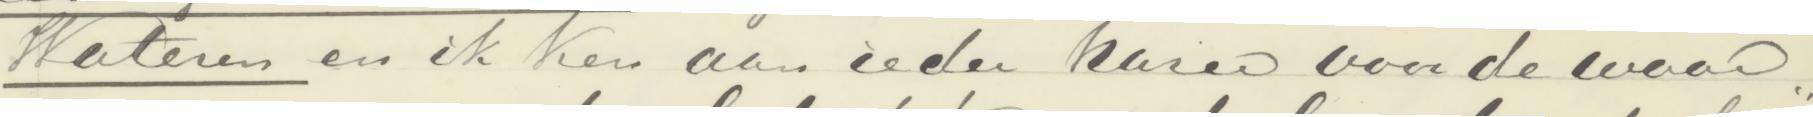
Wateren en ik ken aan ieder harer voor de waar
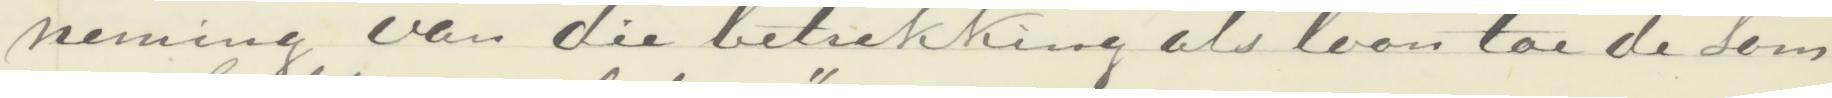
neming van die betrekking als loon toe de som
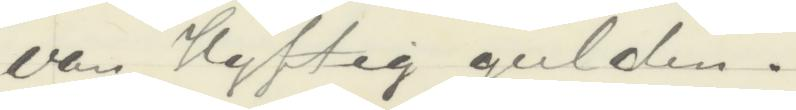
van Vyftig gulden.
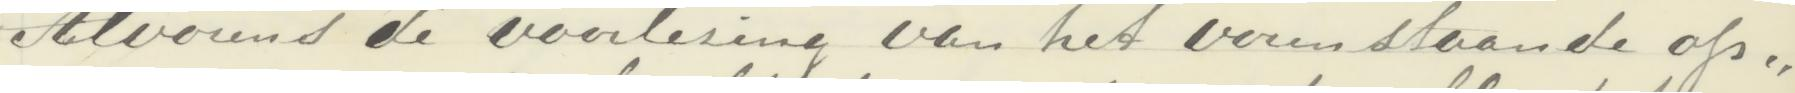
Alvorens de voorlezing van het vorenstaande op„
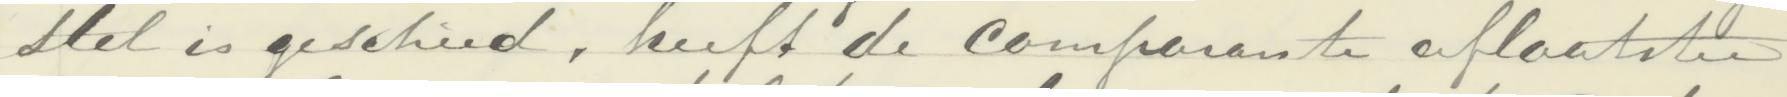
stel is geschied, heeft de comparante erflaatster
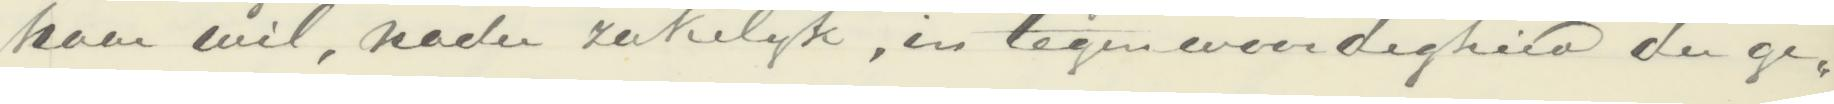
haar wil, nader zakelyk, in tegenwoordigheid der ge„
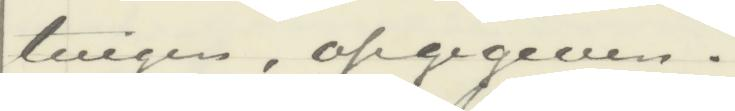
tuigen, opgegeven.
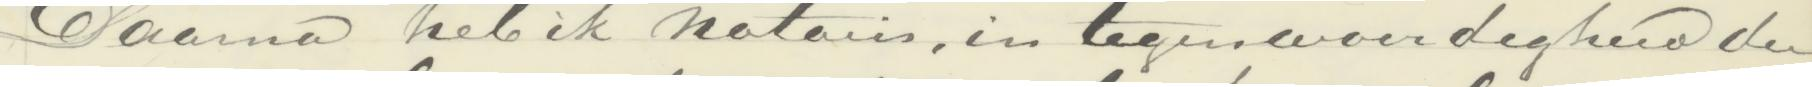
Daarna heb ik notaris, in tegenwoordigheid der
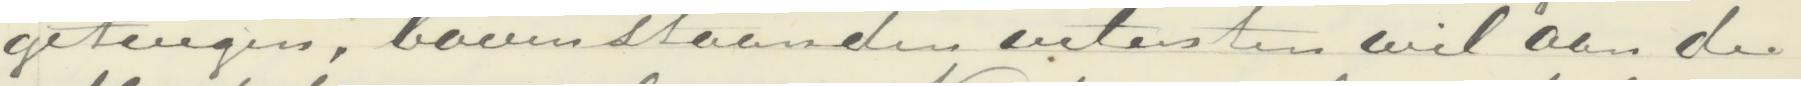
getuigen, bovenstaanden uitersten wil aan den
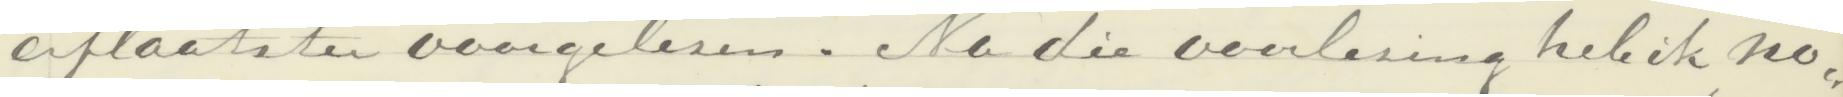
erflaatster voorgelezen. Na die voorlezing heb ik no„
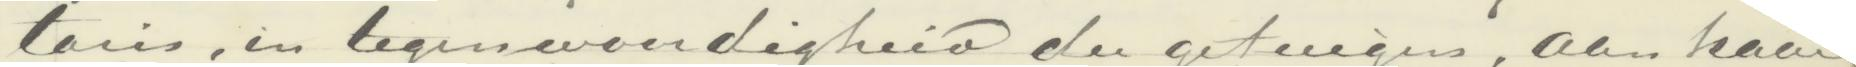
taris, in tegenwoordigheid der getuigen, aan haar
